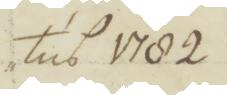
tus 1782
